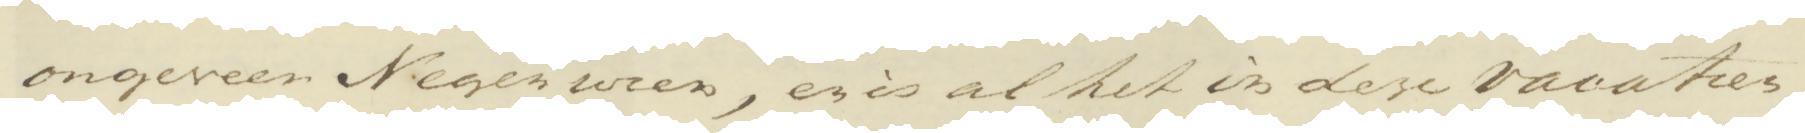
ongeveer Negen wien, en is al het in deze vacatien
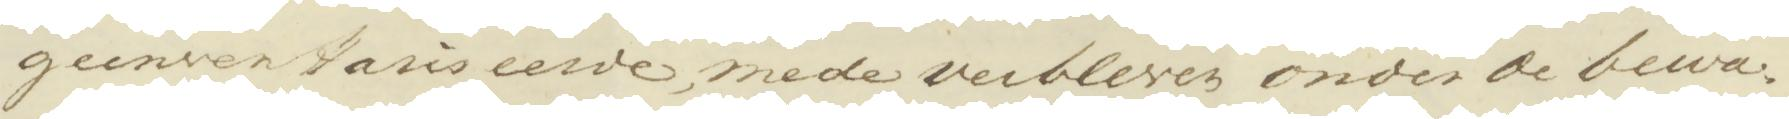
geinventariseerde, mede verbleven onder de bewa,
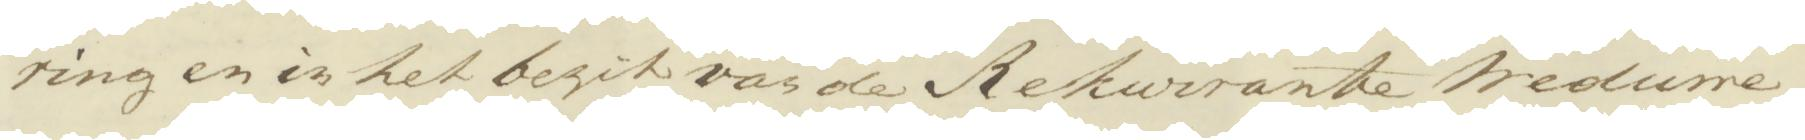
ring en in het bezit van de Rekwirante weduwe,
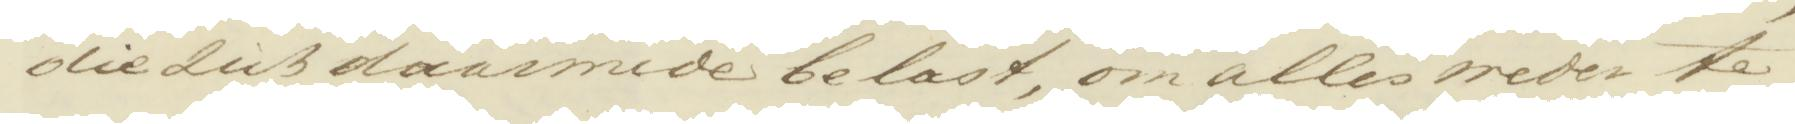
die zich daarmede belast, om alles weder te
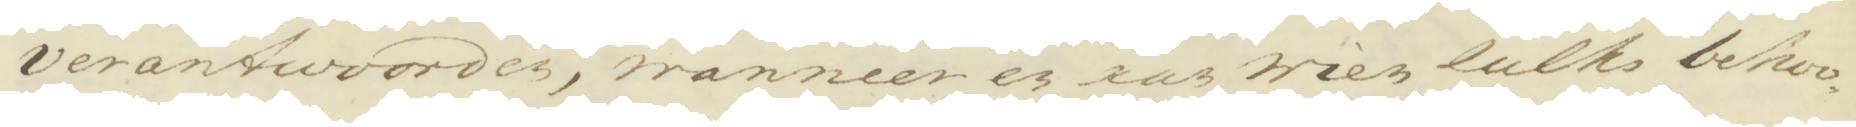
verantwoorden, wanneer en van wien zulks behoo„
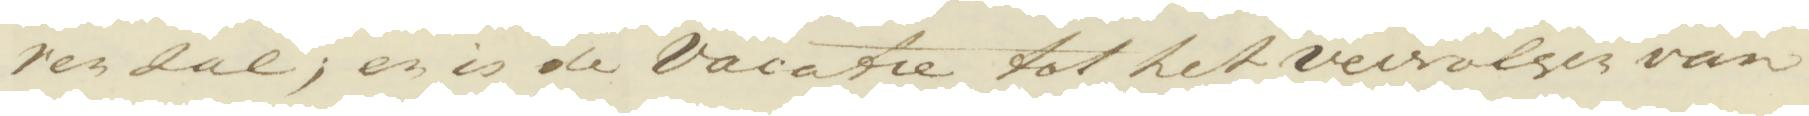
ren zal; en is de Vacatie tot het vervolgen van
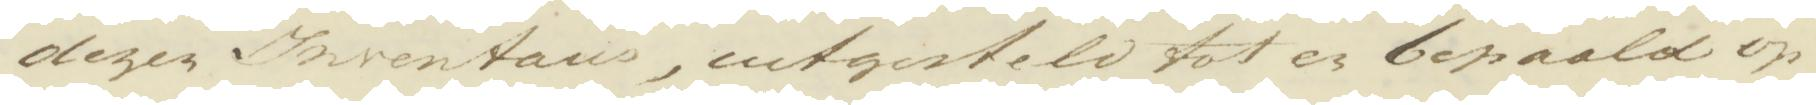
dezen Inventaris, uitgesteld tot en bepaald op
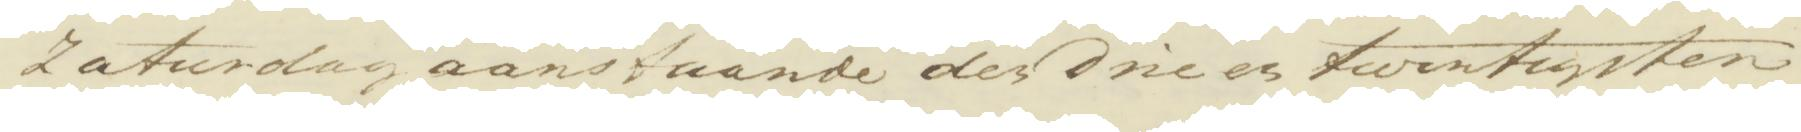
zaturdag aanstaande den drie en twintigsten
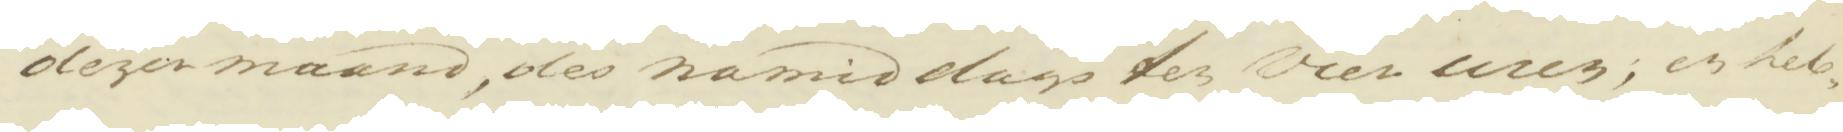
dezen maand, des namiddags ten vier uren; en heb
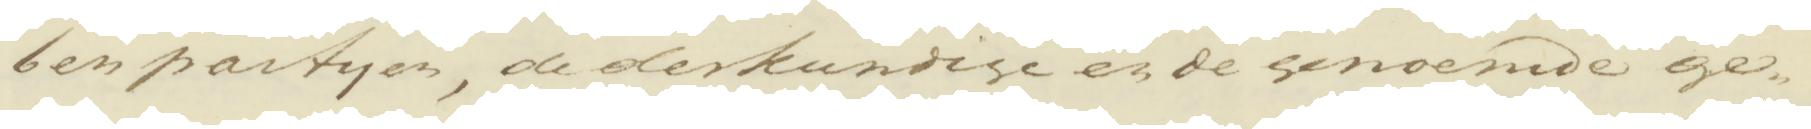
ben partyen, de deskundige en de genoemde ge„
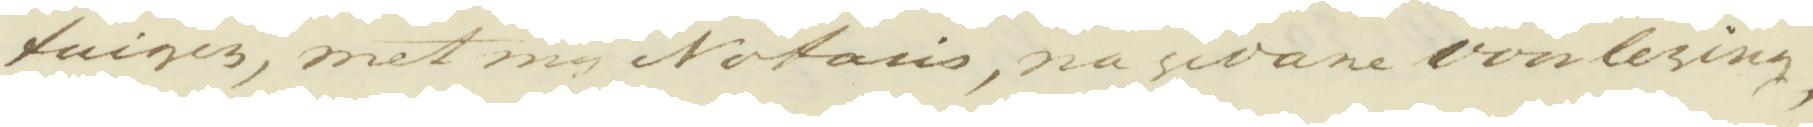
tuigen, met my Notaris, na gedane voorlezing
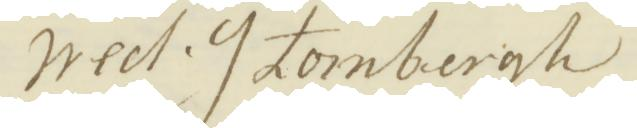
Wed. J tombergh
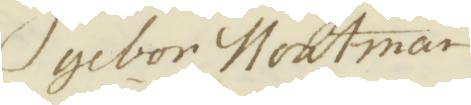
gebor Houtman
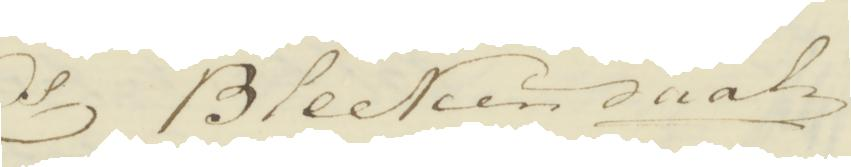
Cs Bleekendaal
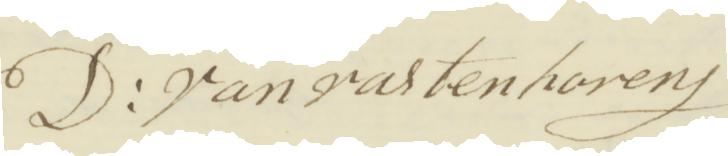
D: van vastenhoven
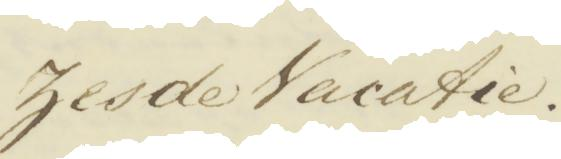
Zesde Vacatie.
